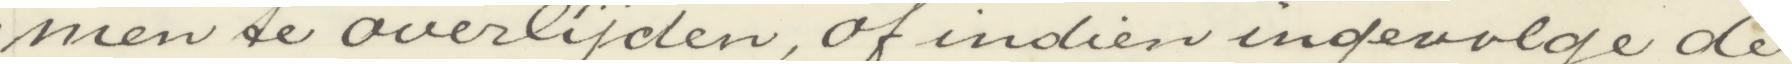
men te overlijden, of indien ingevolge de
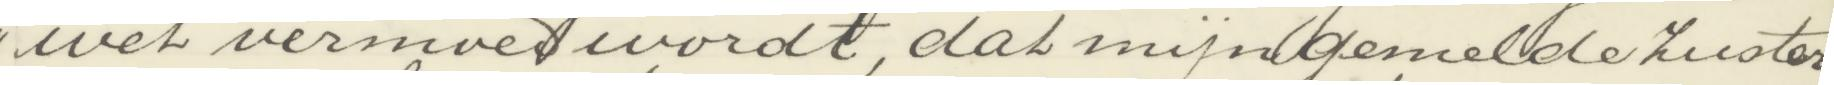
wet vermoed wordt, dat mijn gemelde zuster
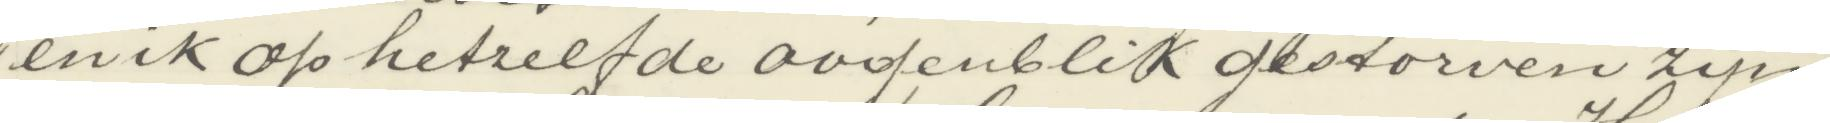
en ik op hetzelfde oogenblik gestorven zijn
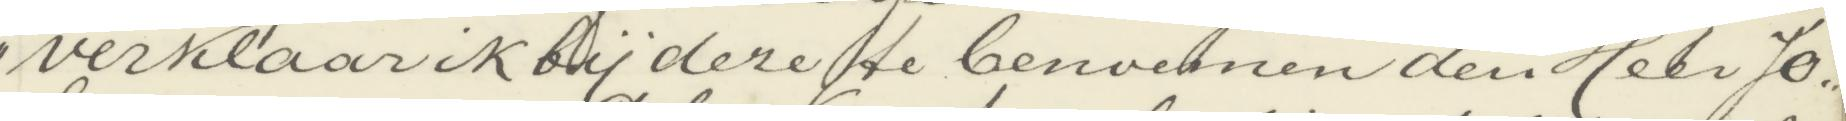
verklaar ik bij deze te benoemen den Heer Jo„
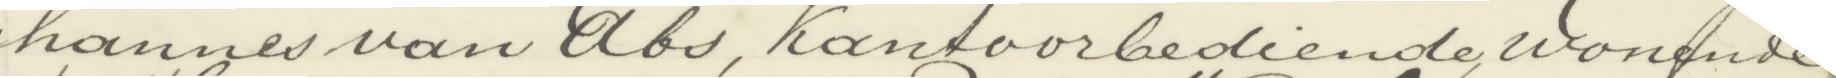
hannes van Abs, kantoorbediende, wonende
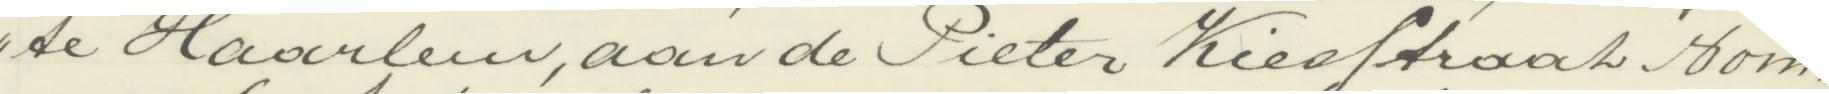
te Haarlem, aan de Pieter Kiesstraat Nom
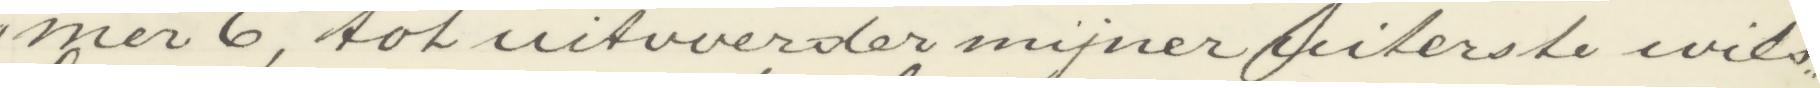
mer 6, tot uitvoerder mijner uiterste wils
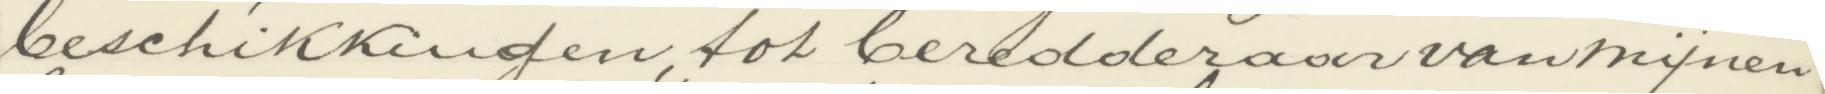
beschikkingen, tot beredderaar van mijnen
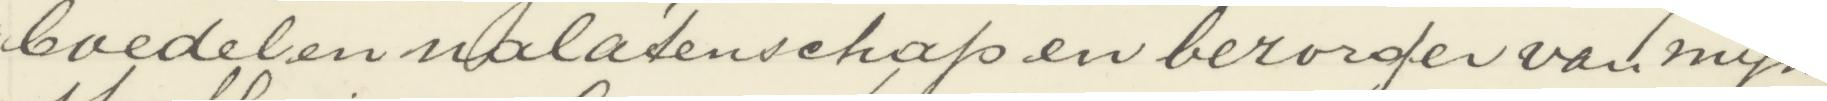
boedel en nalatenschap en bezorger van mijn
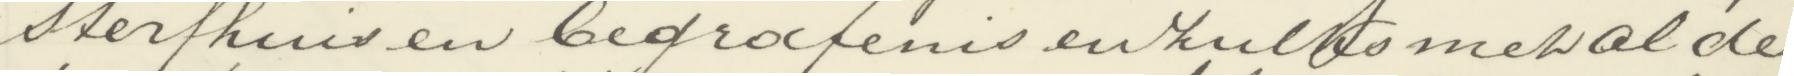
sterfhuis en begrafenis en zulks met al de
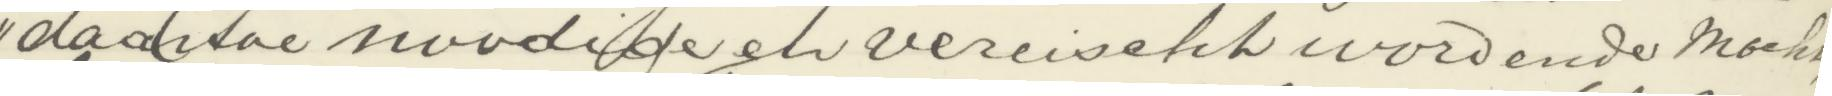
daartoe noodige en vereischt wordende macht,
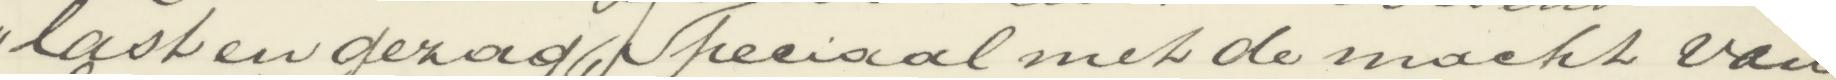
last en gezag, Speciaal met de macht van
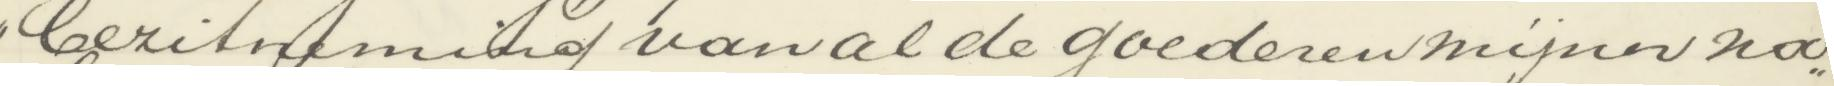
bezitneming van al de goederen mijner na„
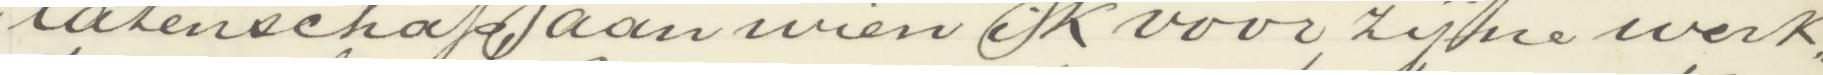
latenschap, aan wien ik voor zijne werk
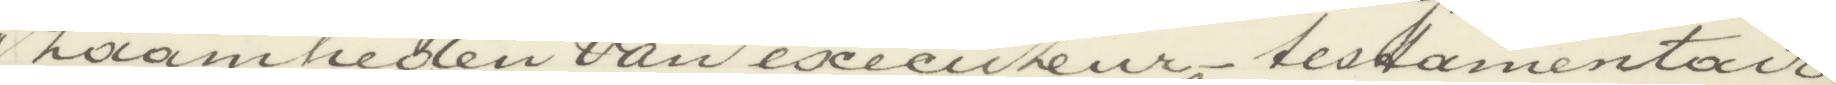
zaamheden van executeur - testamentair
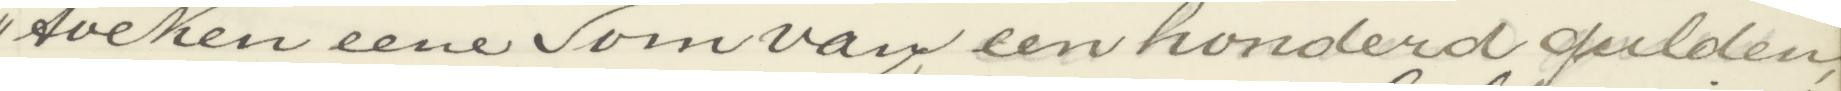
toeken eene som van een honderd gulden,
